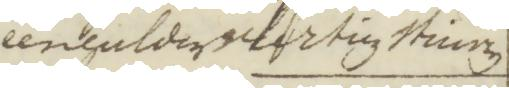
een gulden veertien stuivers
